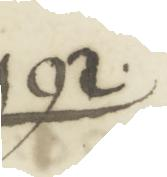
92:
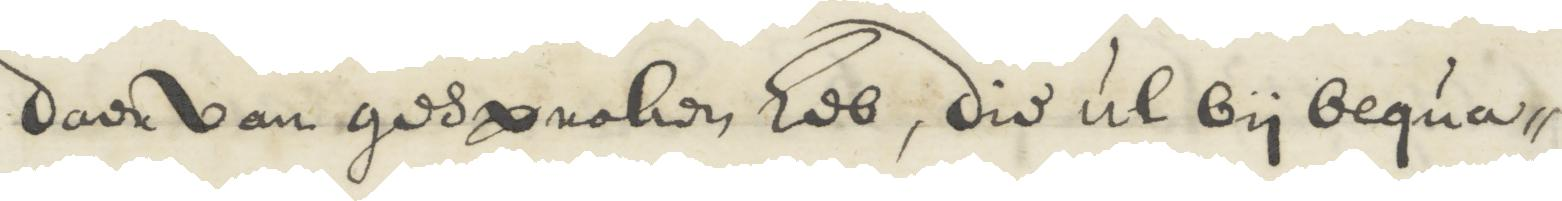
daer van gesproken heb, die ul bij bequa„
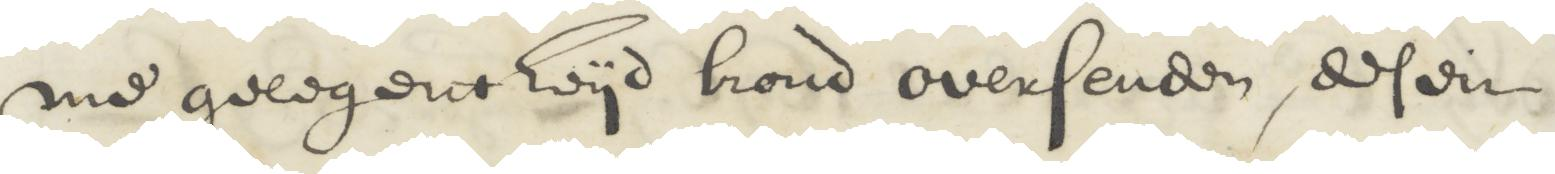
me gelegentheijd kond oversenden, desen
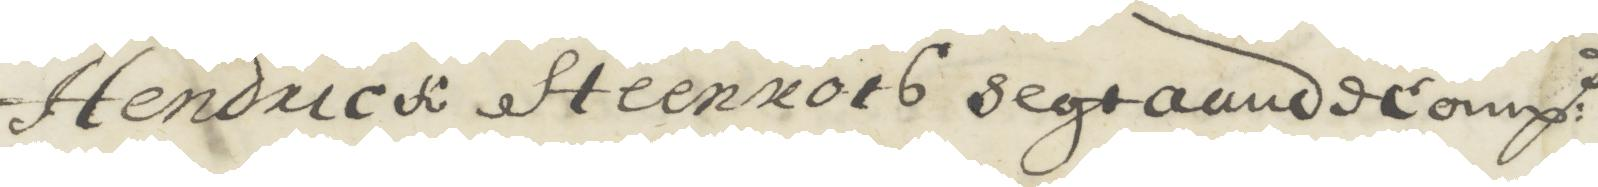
Hendrick Steenrots segt aande Comp:s
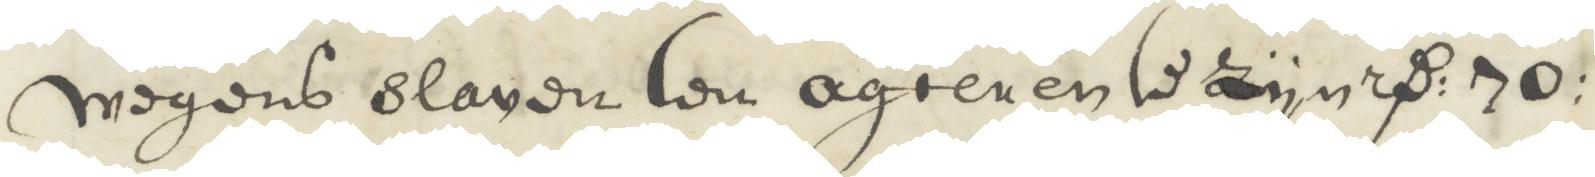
wegens slaven ten agteren te zijn rp: 70:
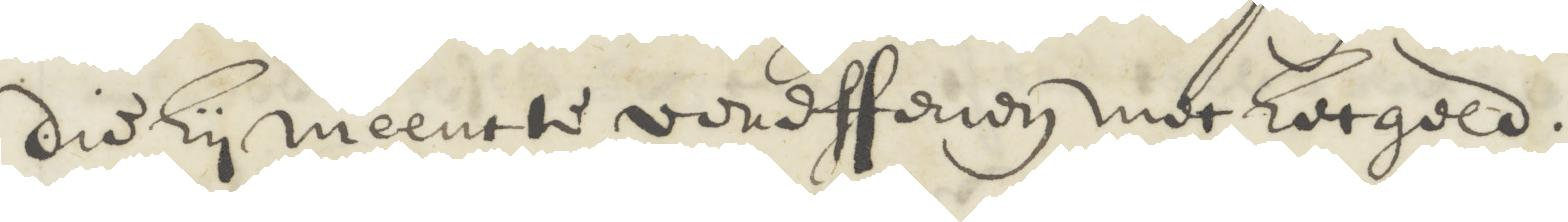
die hij meent te vereffenen met het geld.
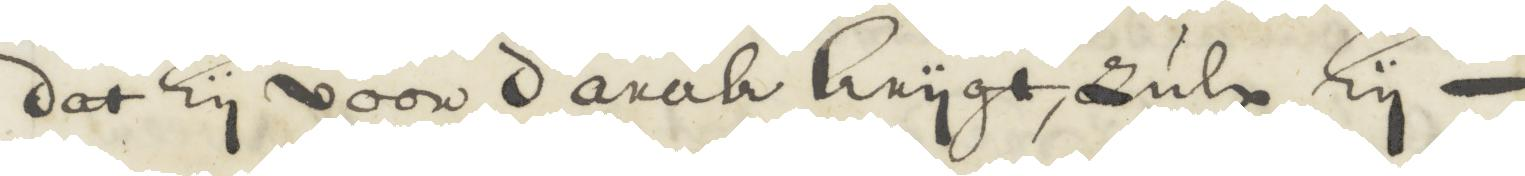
dat hij voor d'arak krijgt, zulx hij —
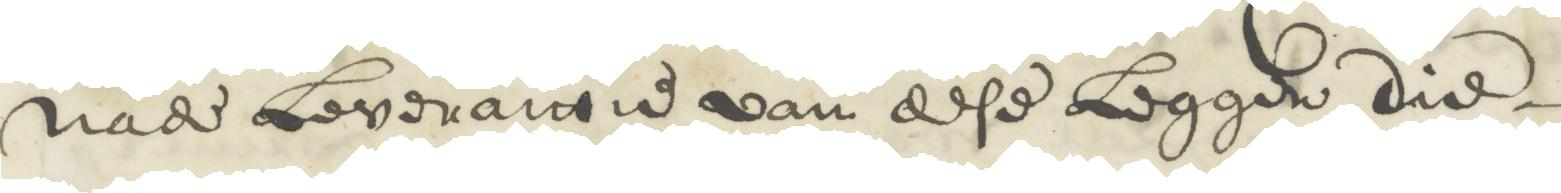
nade leverantie van dese legger die —
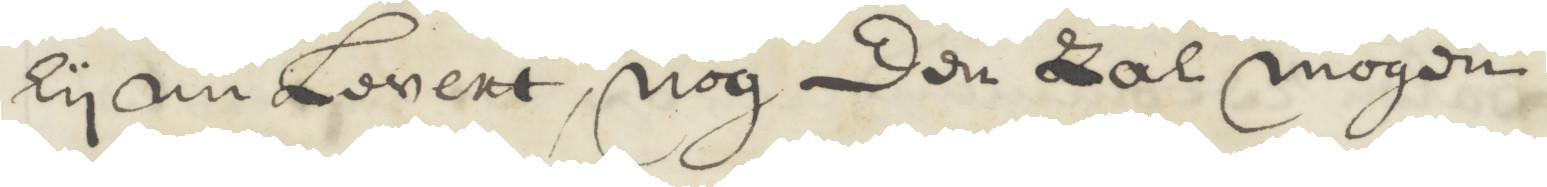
hij nu levert, nog Een zal mogen
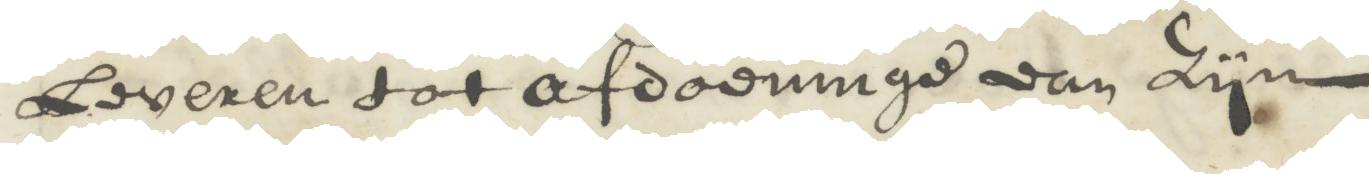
leveren tot afdoeninge van zijn
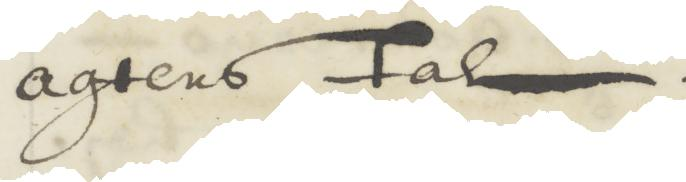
agterstal.
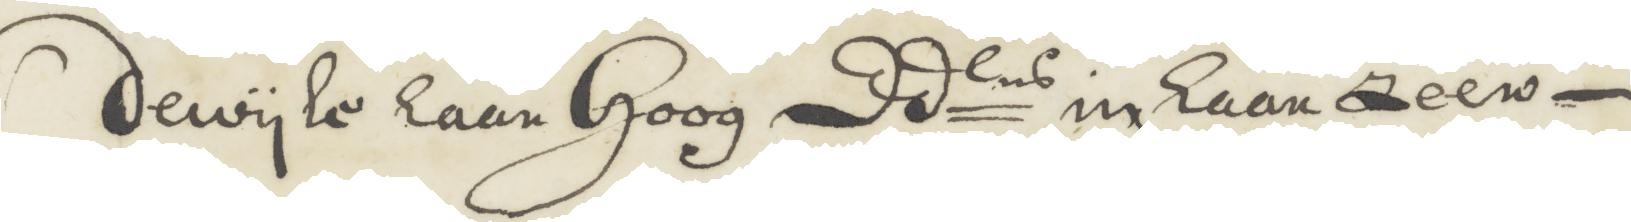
dewijle haar Hoog Ed=ens in haar zeer —
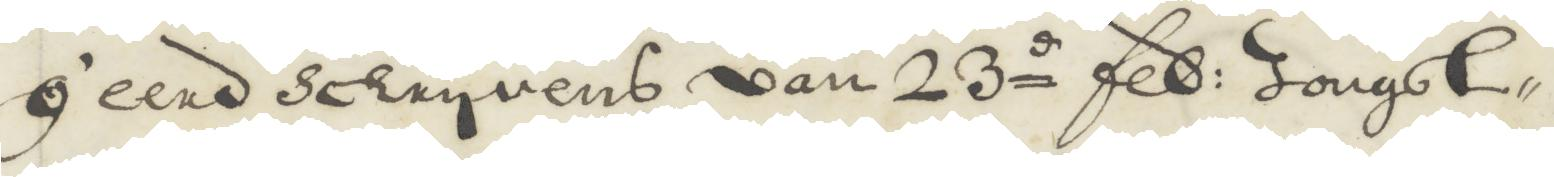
g’eerd schrijvens van 23=en feb: Jongst„
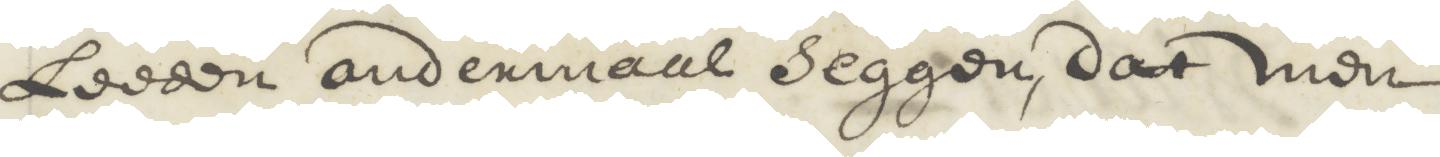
leeden andermaal seggen, dat men
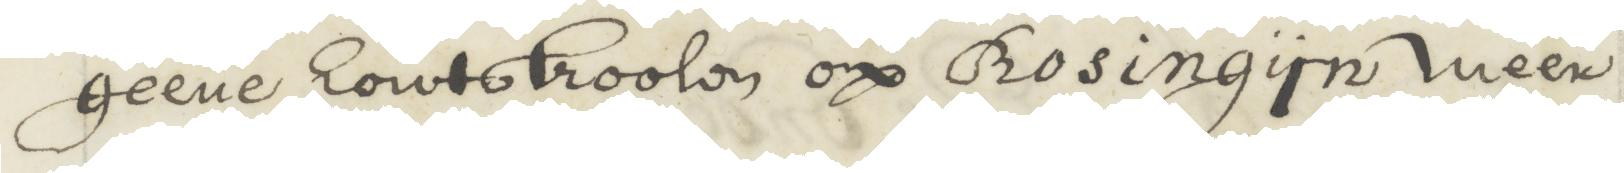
geene houtskoolen op Rosingijn meer
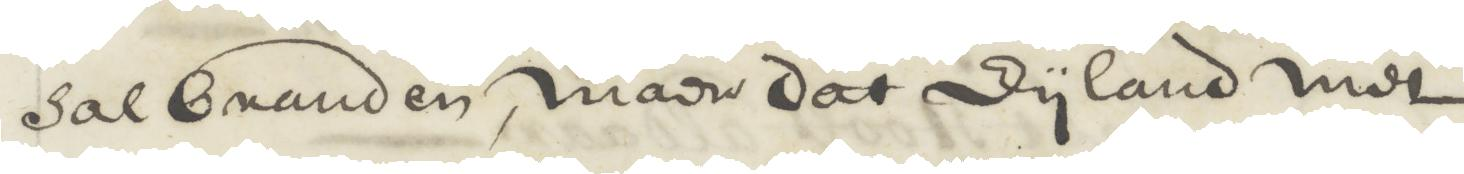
sal branden, maer dat Eijland met
